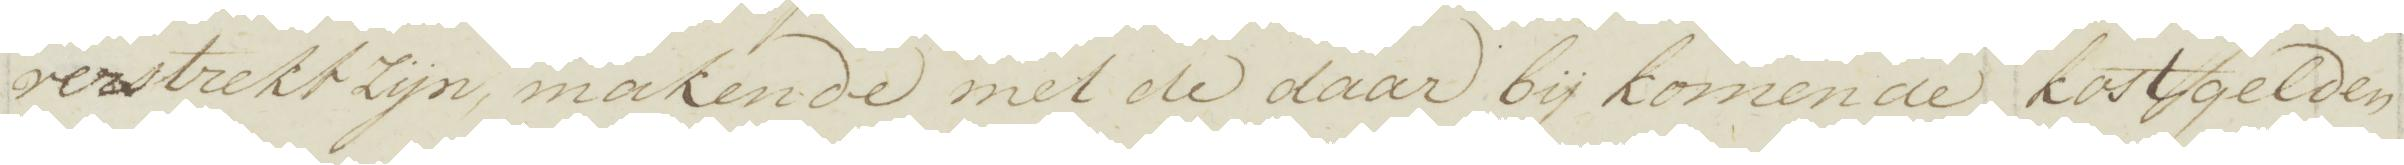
verstrekt zijn, makende met de daar bij komende kostgelden
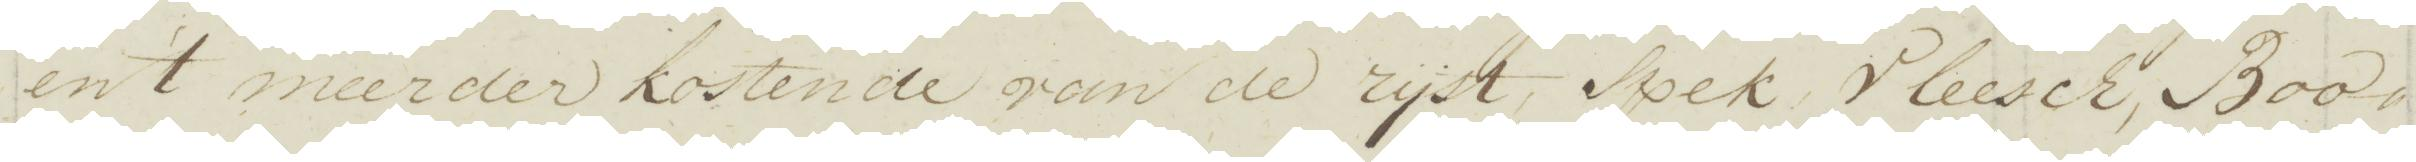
en ’t meerder kostende van de rijst, Spek Vleesch, Boo
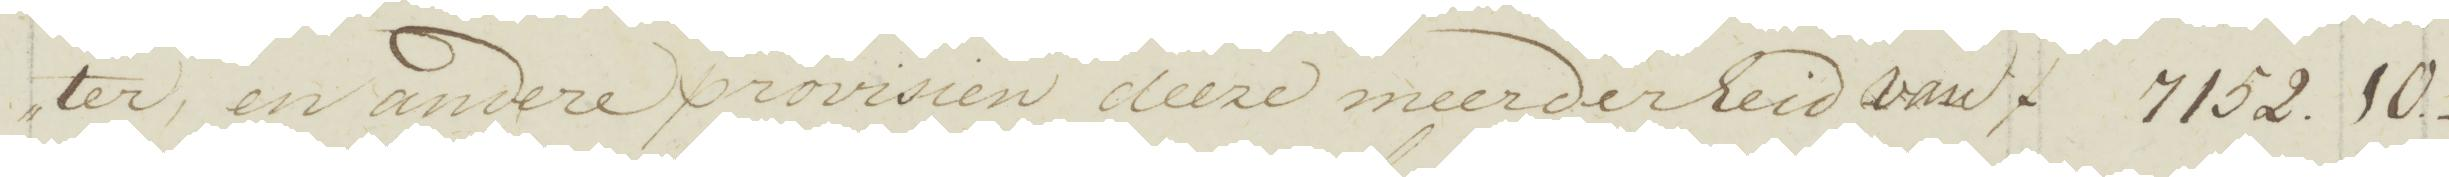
„ter, en andere provisien deeze meerderheid van ƒ 7152. 10.— .
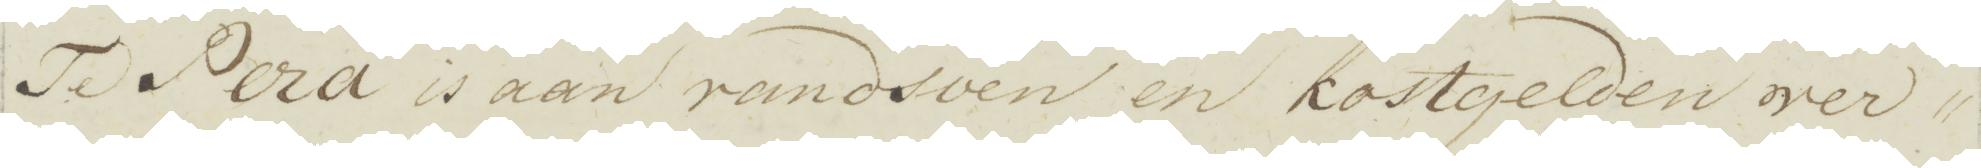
Te Pera is aan randsoen en kostgelden ver„
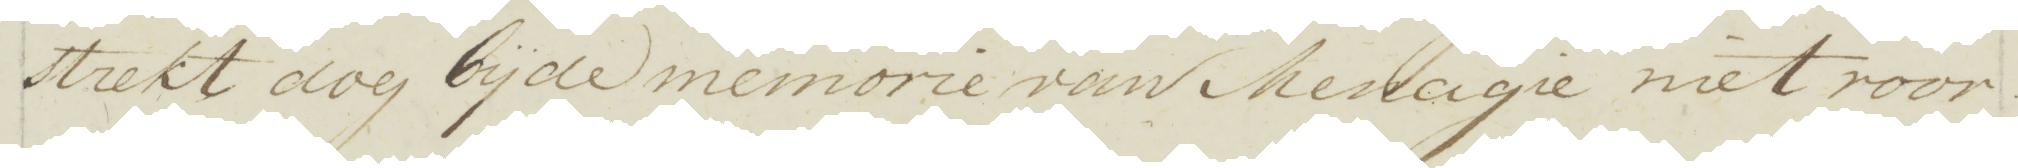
strekt dog bij de memorie van Menagie niet voor
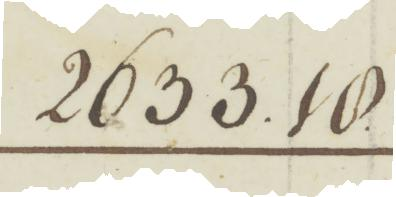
2633.18.
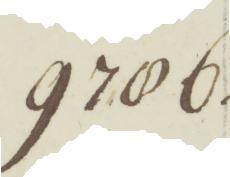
9786. 8. -.
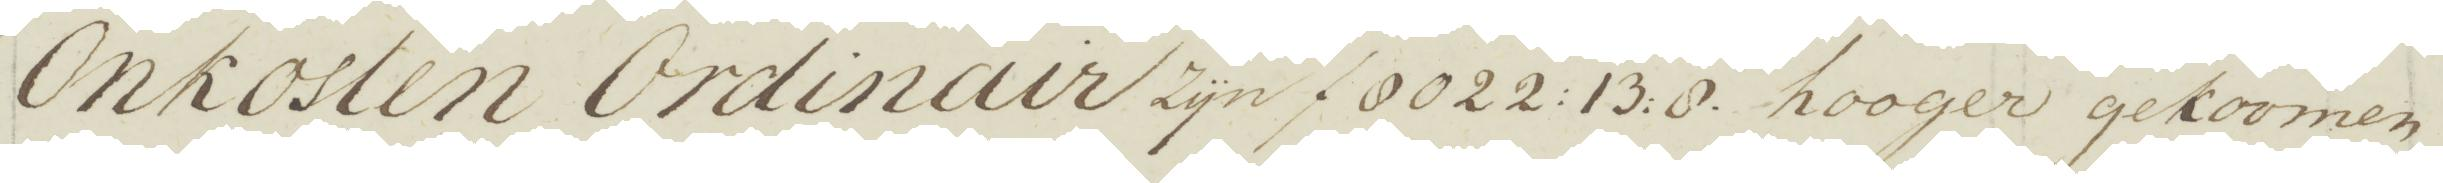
Onkosten Ordinair zijn ƒ 8022: 13: 8. hooger gekoomen
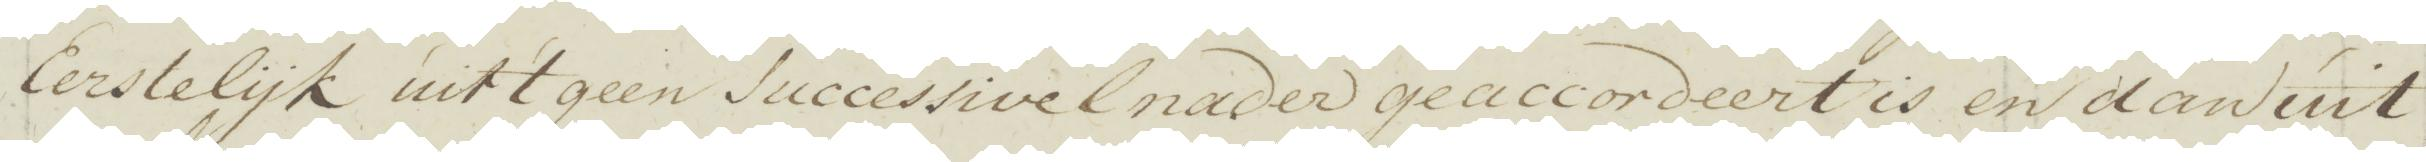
Eerstelijk uit 't geen Successvel nader geaccordeert is en dan uit
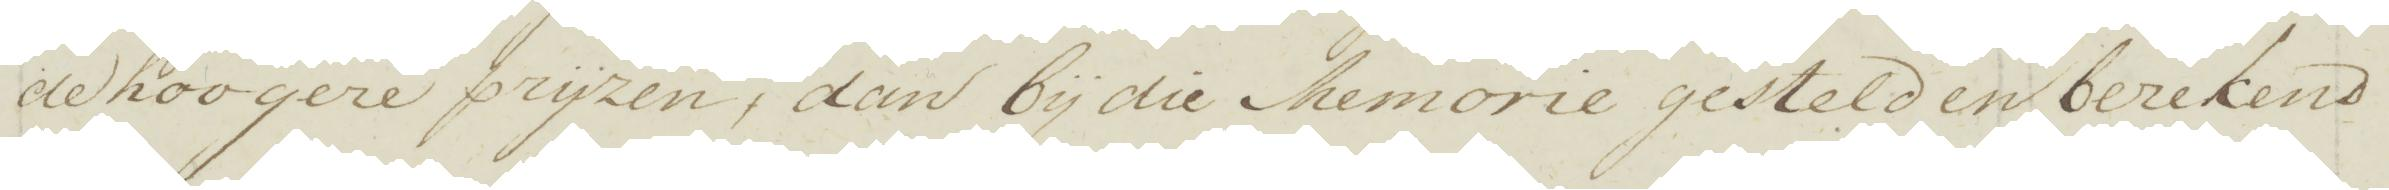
de hoogere prijzen, dan bij die Memorie gesteld en berekend
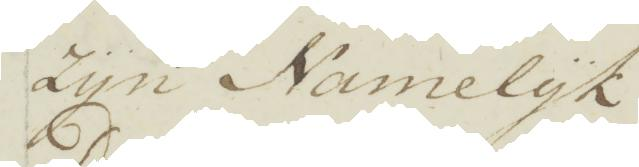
zijn Namelijk
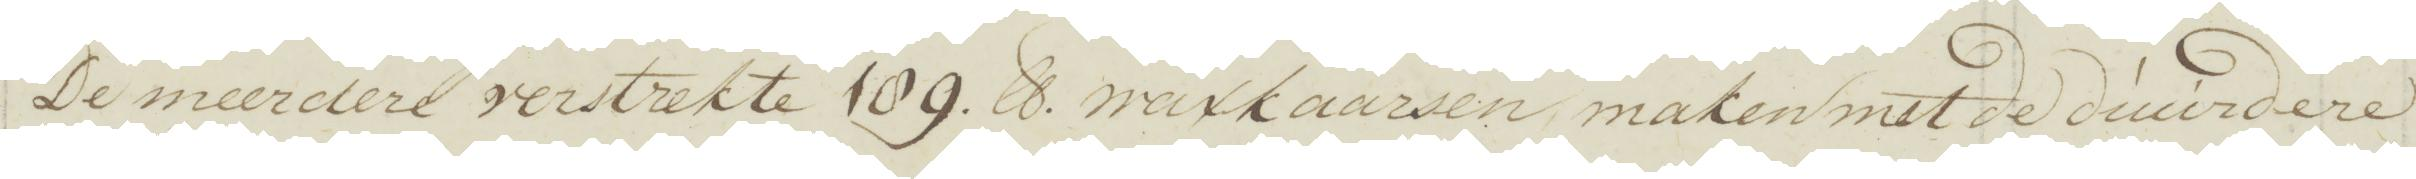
De meerdere verstrekte 189. lb. waxkaarsen maken met de duurdere
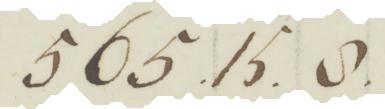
ƒ 565: 15. 8.
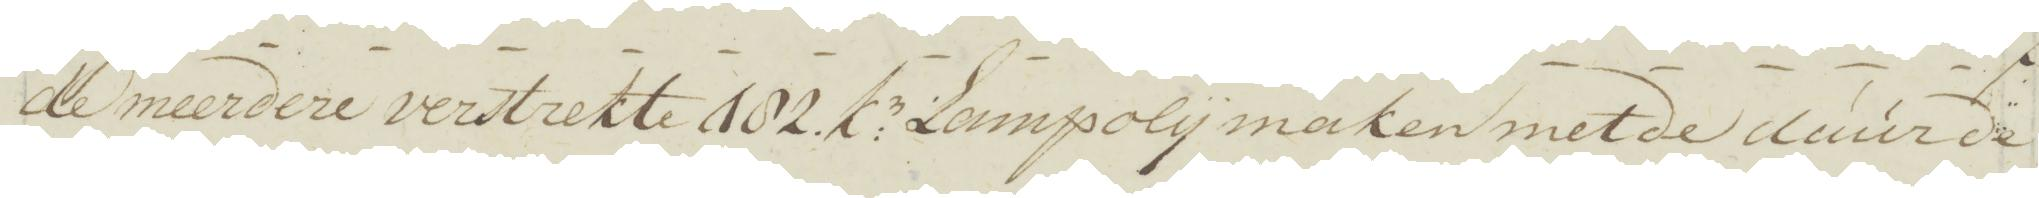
de meerdere verstrekte 482. k:n Lampolij maken met de duur en
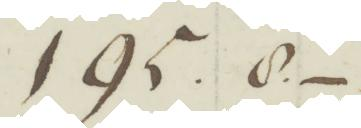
195: 8. -.
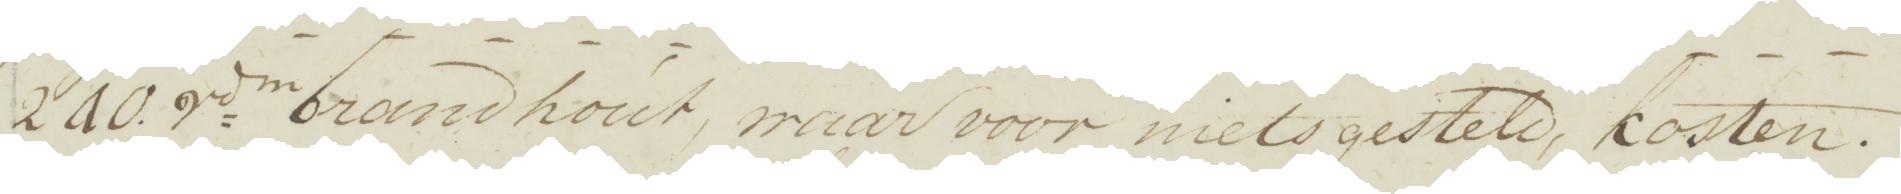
240. v=dm brandhout, waar voor niets gesteld, kosten.
